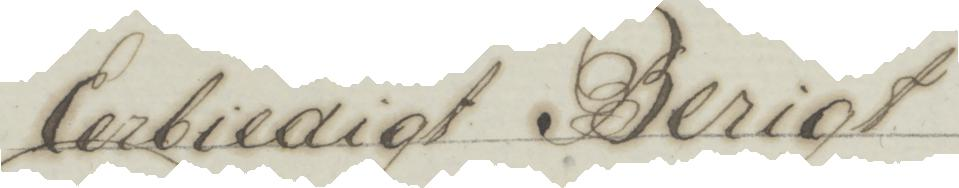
Eerbiedigt Berigt
